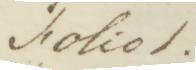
Folio 1.
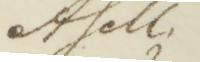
AsM,
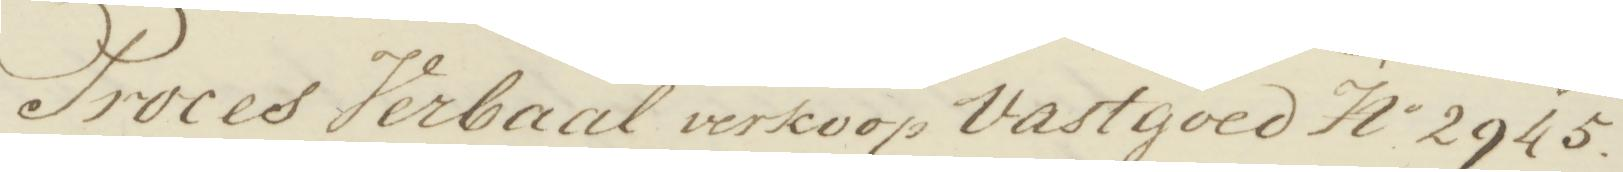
Proces Verbaal verkoop Vastgoed No 2945.
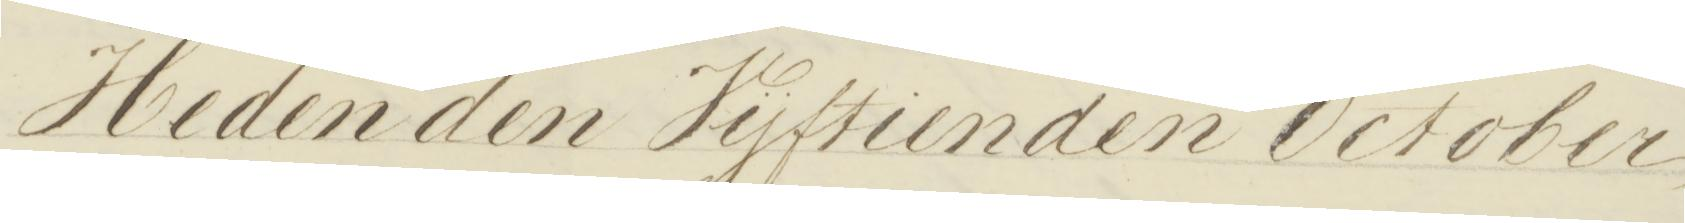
Heden den Vijftienden October
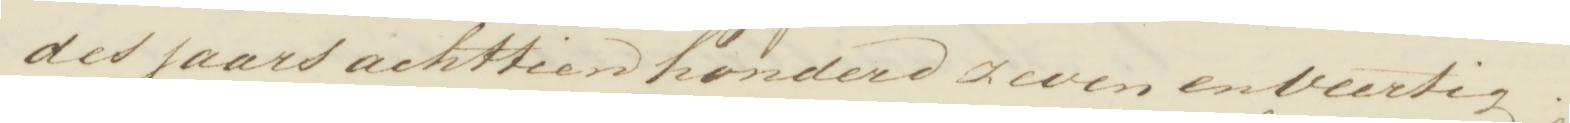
des jaars achttien honderd zeven en veertig.
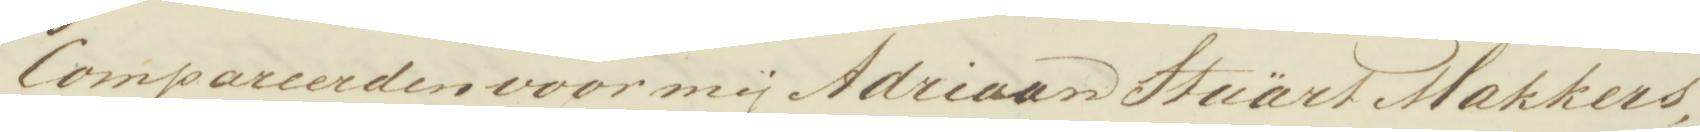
Compareerden voor mij Adriaan Stuärt Makkers,
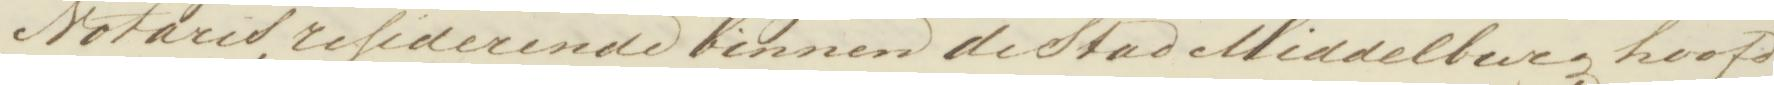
Notaris, residerende binnen de Stad Middelburg, hoofd
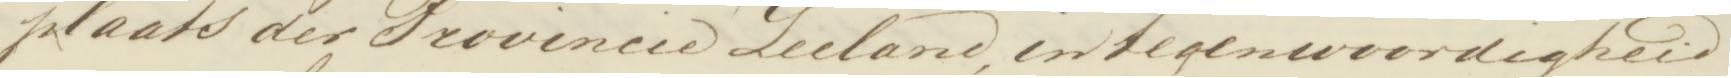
plaats der Provincie Zeeland, in tegenwoordigheid
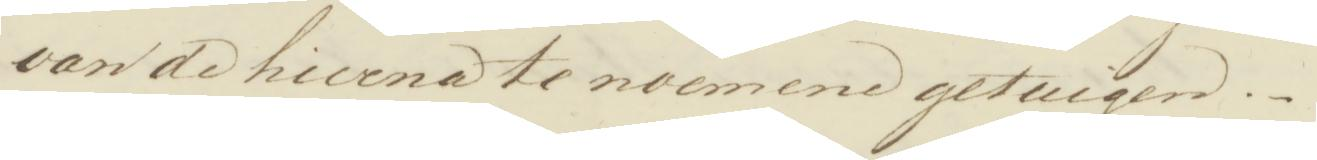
van de hierna te noemene getuigen.
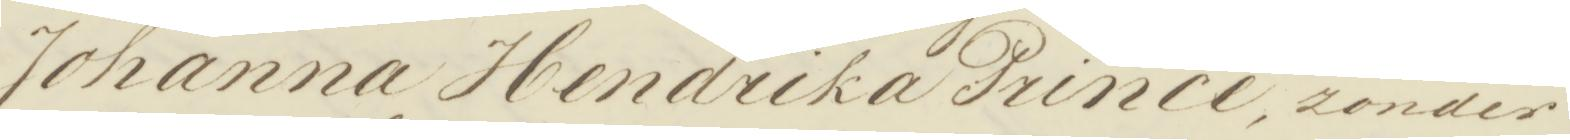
Johanna Hendrika Prince, zonder
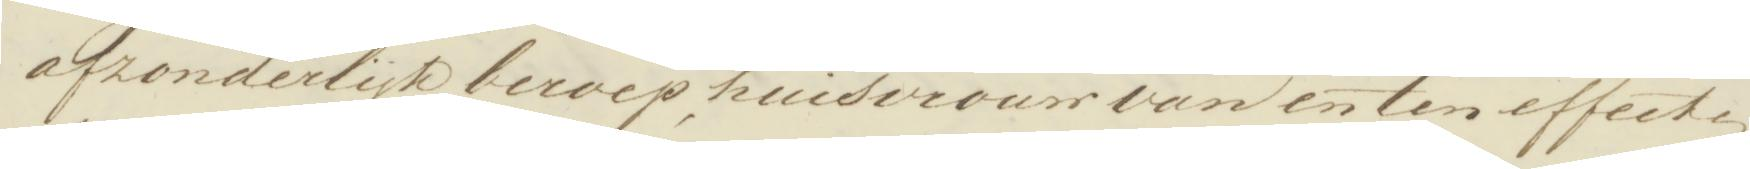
afzonderlijk beroep, huisvrouw van en ten effecte
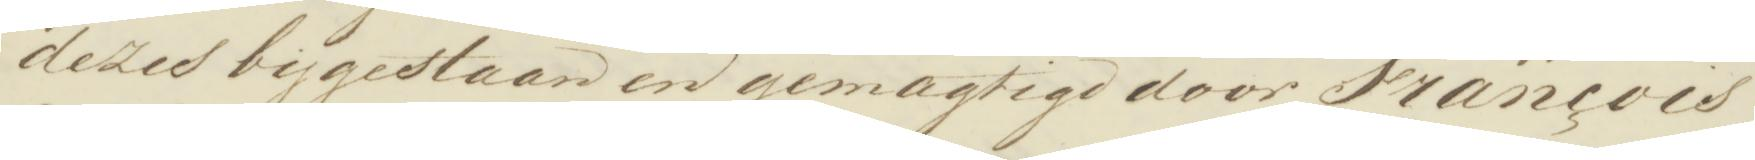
dezes bijgestaan en gemagtigd door François
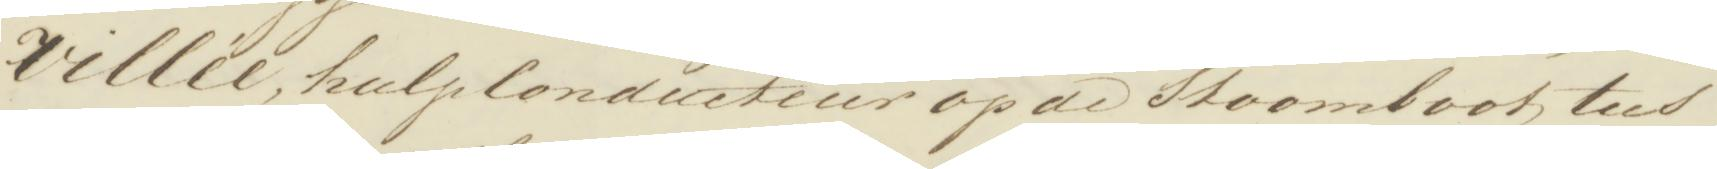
Villée, hulp Conducteur op de stoomboot tus
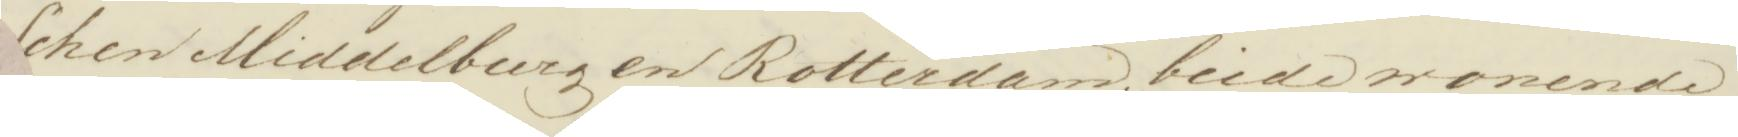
schen Middelburg en Rotterdam, beide wonende
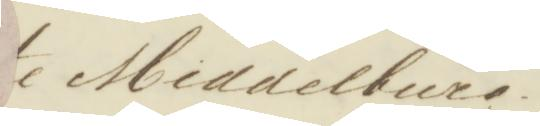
te Middelburg.
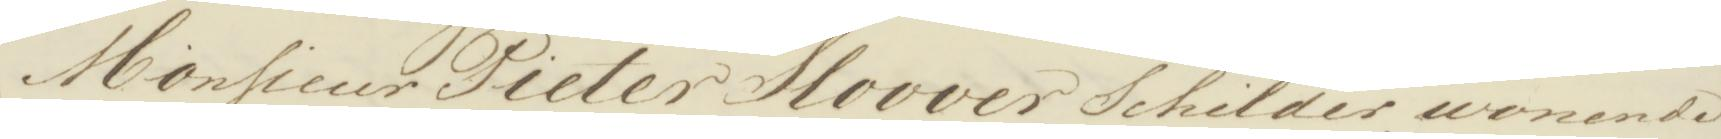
Monsieur Pieter Sloover, schilder, wonende
